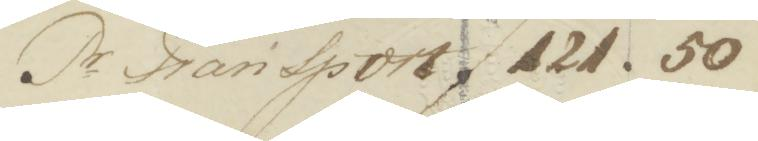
P=r Transport ƒ 121. 50
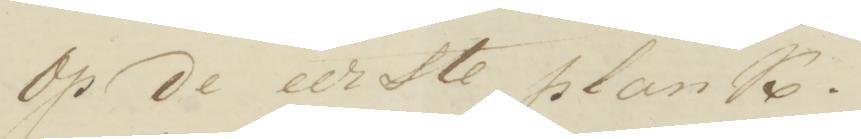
op de eerste plank.
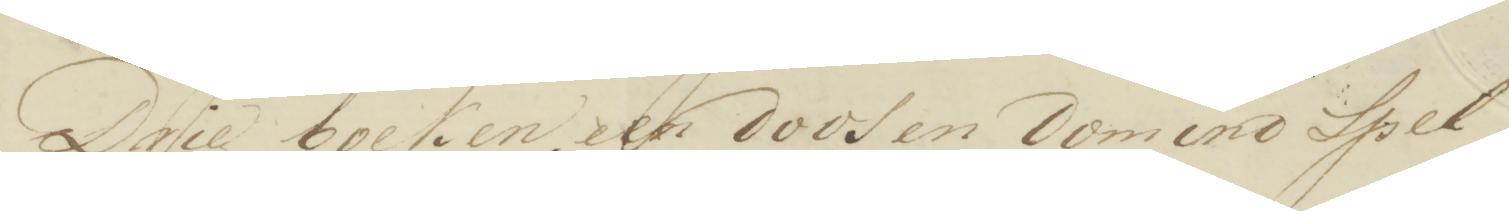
Drie boeken, een doos en domino spel,
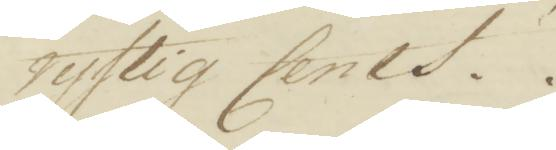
vyftig Cents . . . . . . . . . „ „ 50
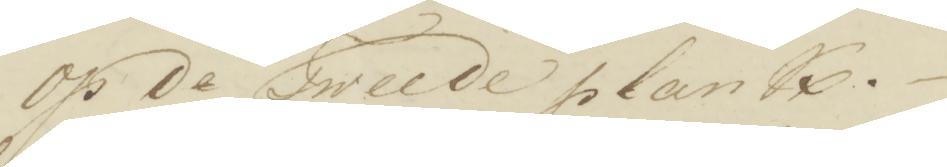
op de Tweede plank.
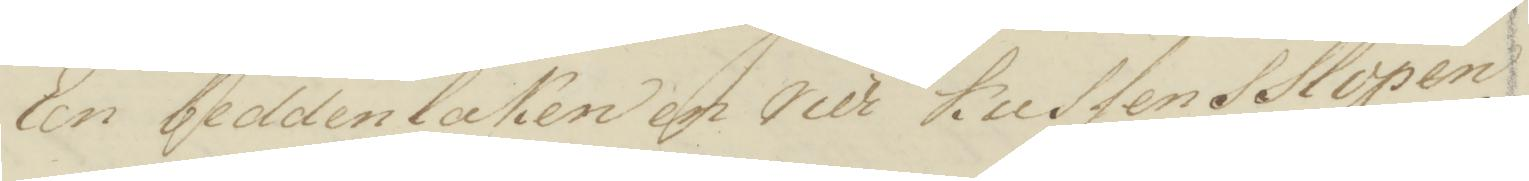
Een beddenlaken en vier kussensslopen,
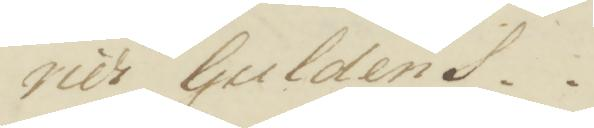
vier Guldens . . . . . . . . . . „ 4 „
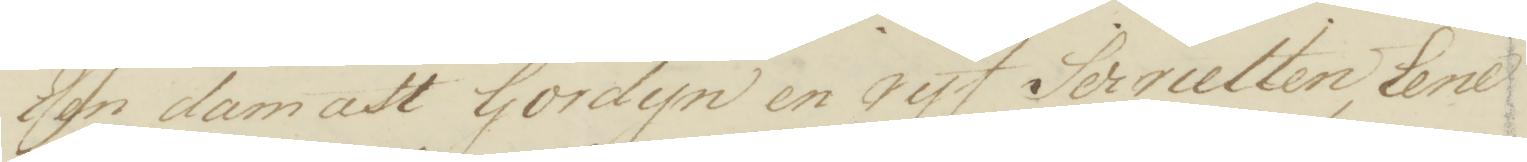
Een damast Gordyn en vyf Servietten, Eene
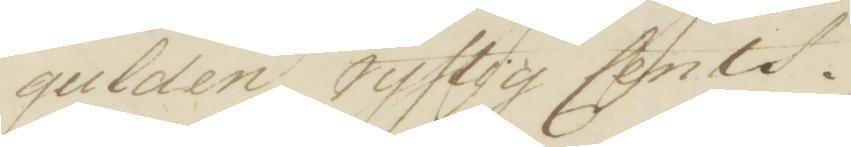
gulden, vyftig Cents . . . . . . . „ 1 50
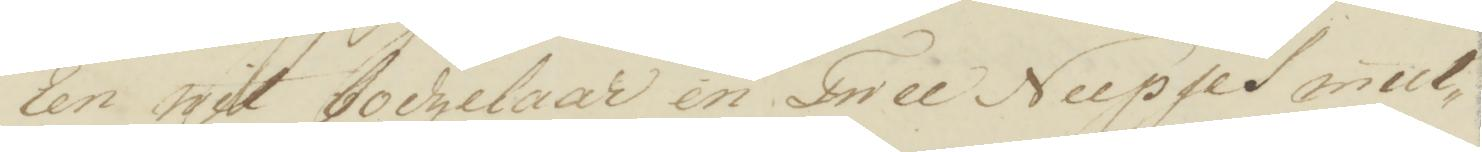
Een wit boezelaar en Twee Neepjes mut„
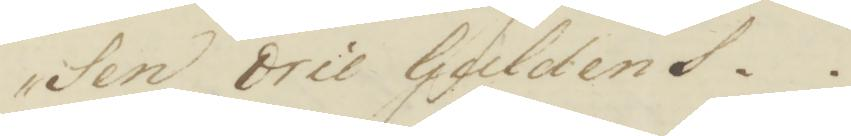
„sen, drie Guldens . . . . . . . . . „ 3 „
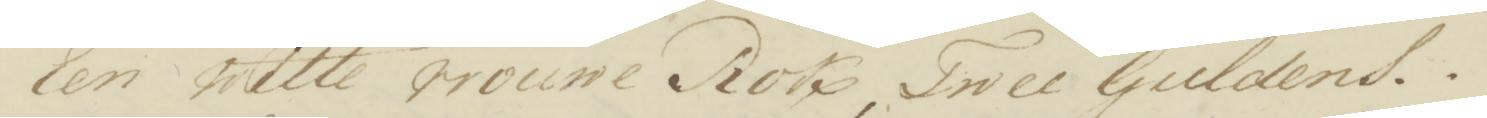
Een witte vrouwe Rok, Twee Guldens . . 2
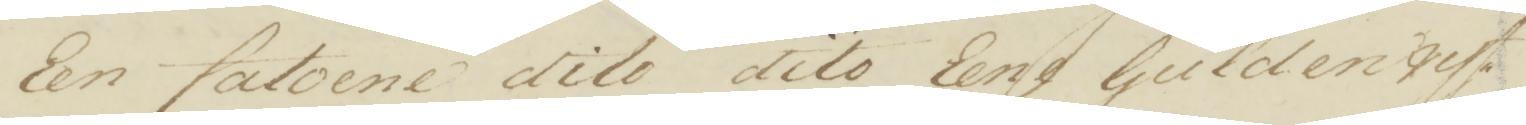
Een Catoene dito dito, Eene Gulden vyf„
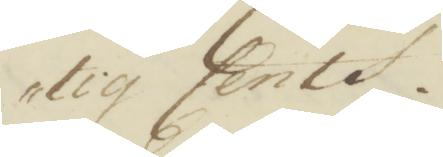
„tig Cents . . . . . . . . . . . . „ 1 50
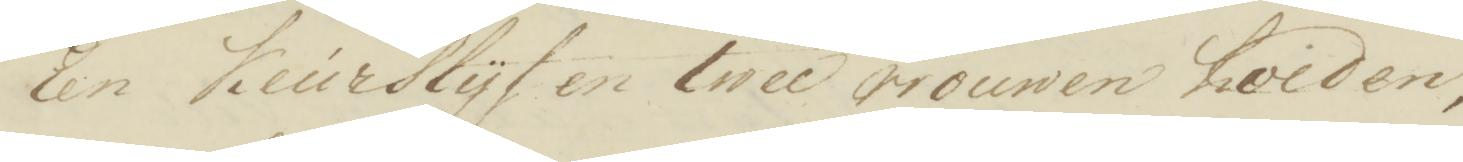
Een keurslijf en twee vrouwen hoeden,
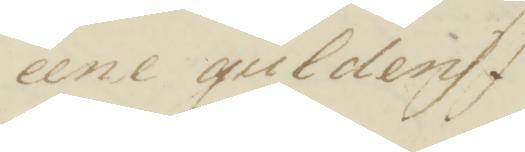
eene gulden . . . . . . . . . . „ 1
